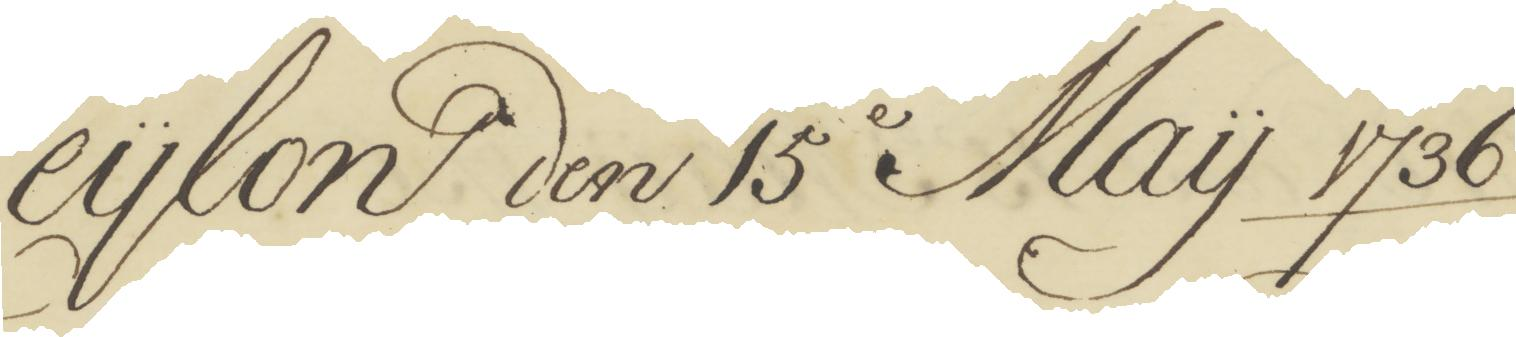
Ceijlon den 15e Maij 1736
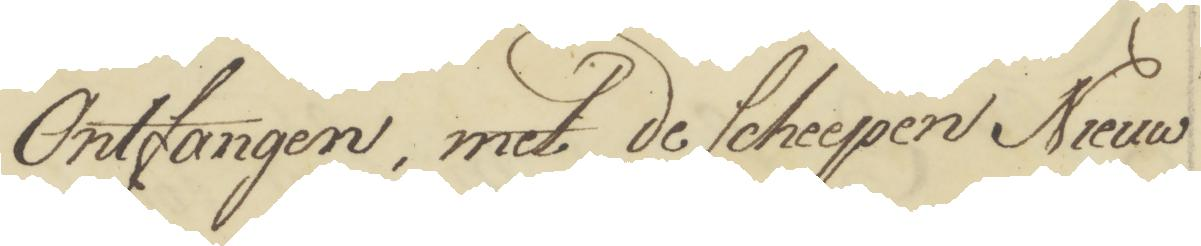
Ontfangen, met de scheepen Nieuw
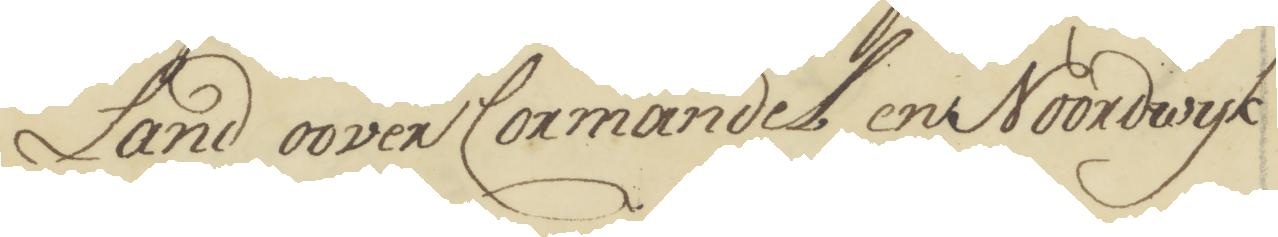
Land oover Cormandel en Noordwyk
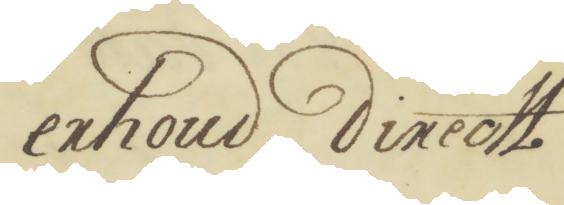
erhoud directt.
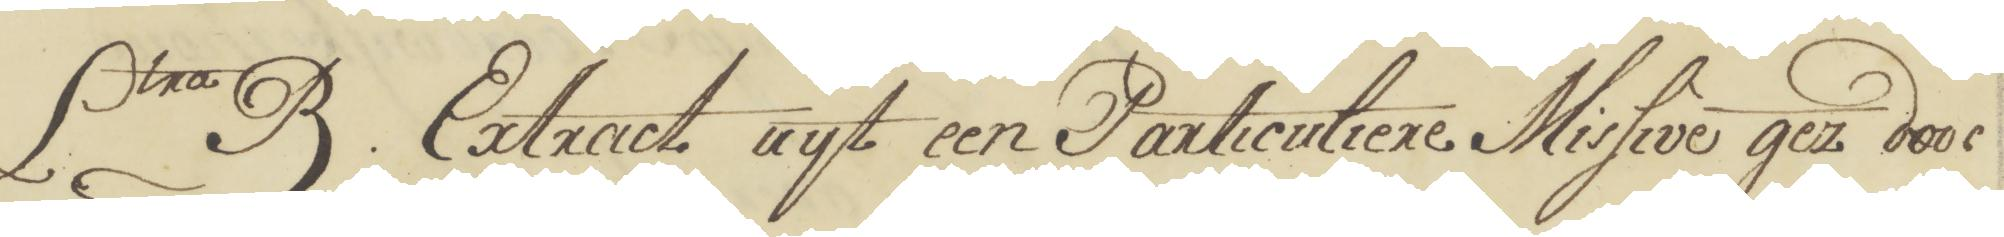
Ltra B. Extract uijt een Particuliere Missive gez door
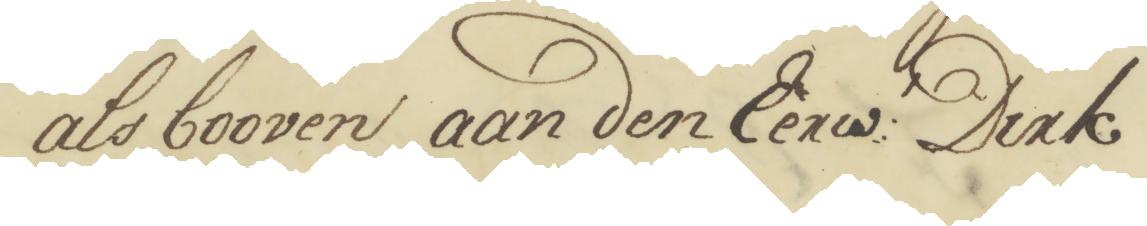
als booven aan den Eerw: Dirk
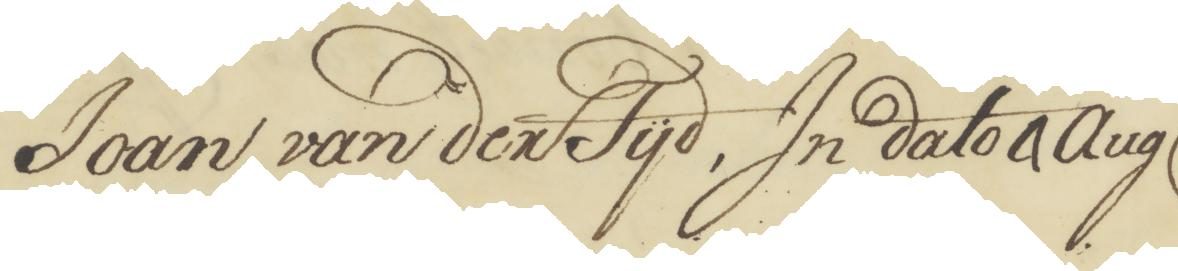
Joan van der Tijd, Jn dato 4 Aug.
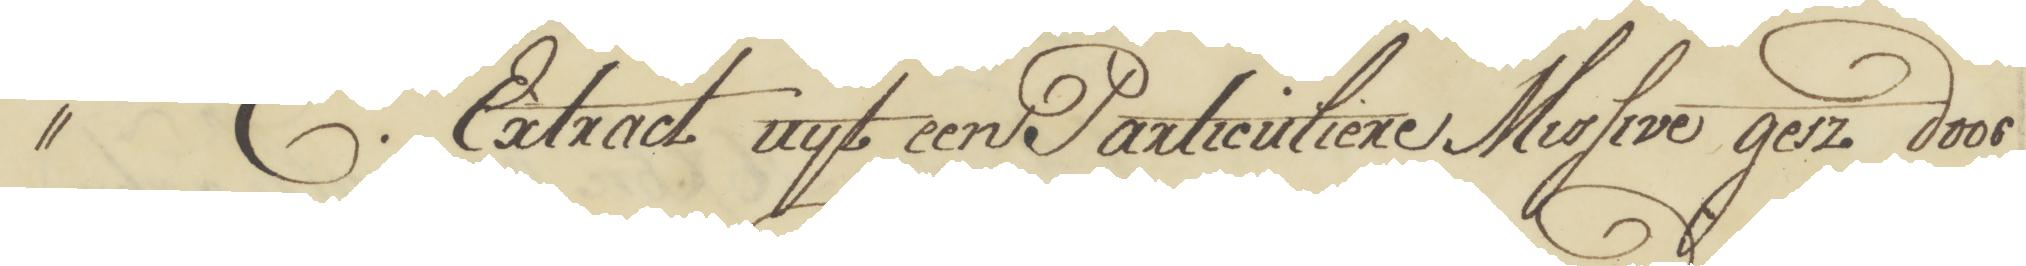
„ C. Extract uijt een Particuliere Missive gesz door
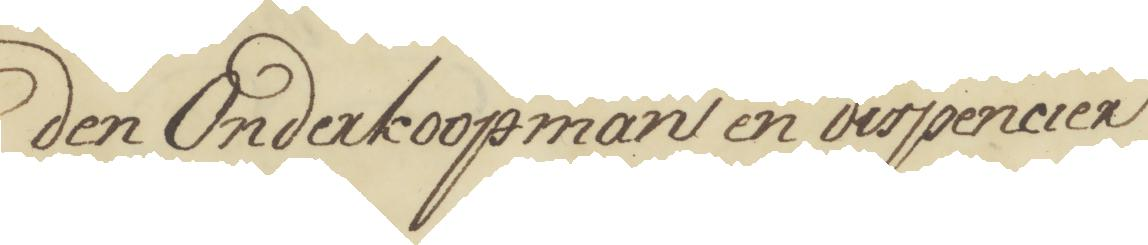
den Onderkoopman en dispencier
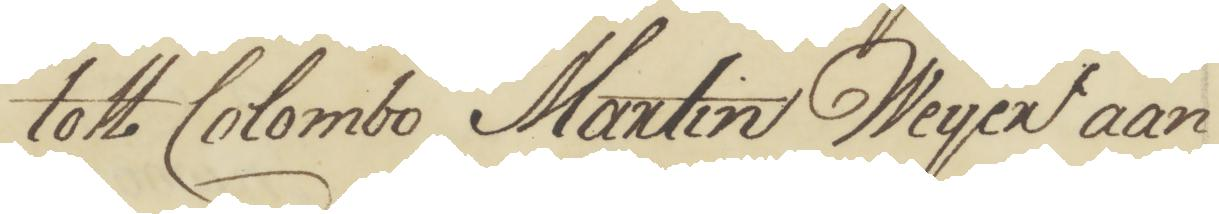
tott Colombo Martin Weijer aan
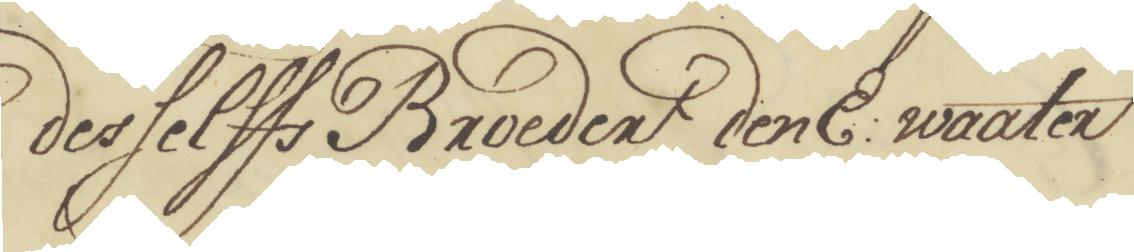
desselffs Broeder den E: waater
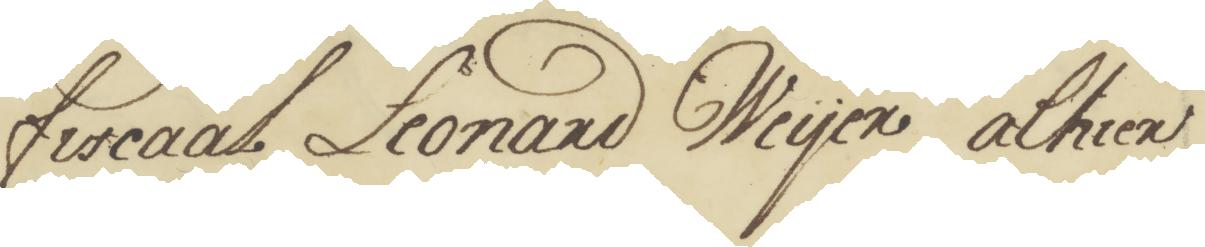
fiscaal, Leonard Weijer alhier
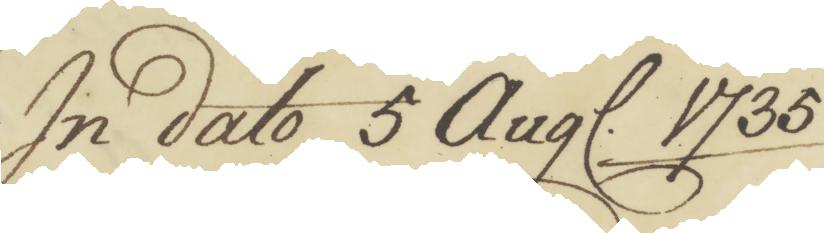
Jn dato 5 Aug.s 1735
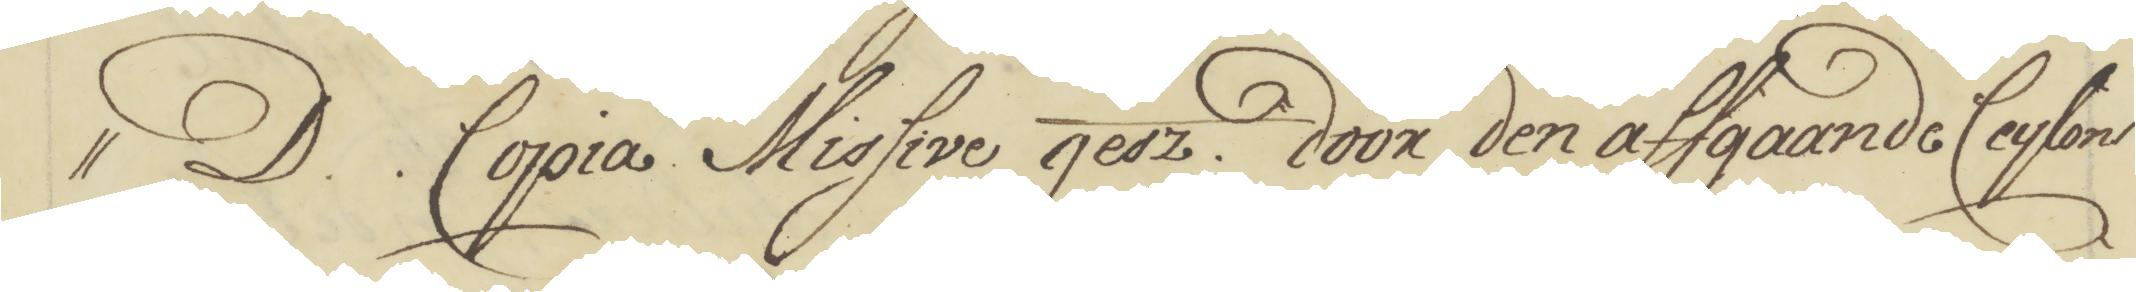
„ D. .Copia Missive gesz. door den affgaande Ceijlons
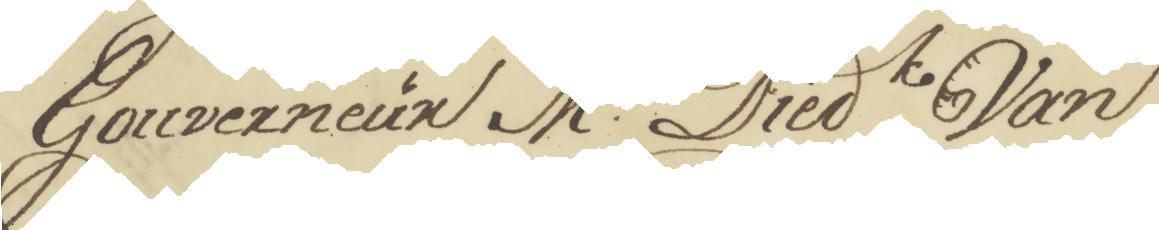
Gouverneur M:r Died:k Van
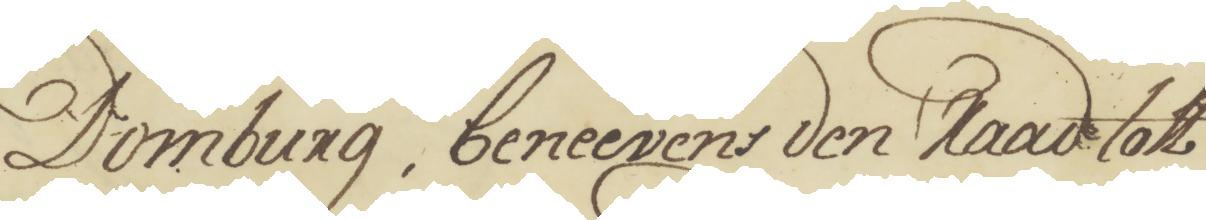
Domburg, beneevens den Raad tott
